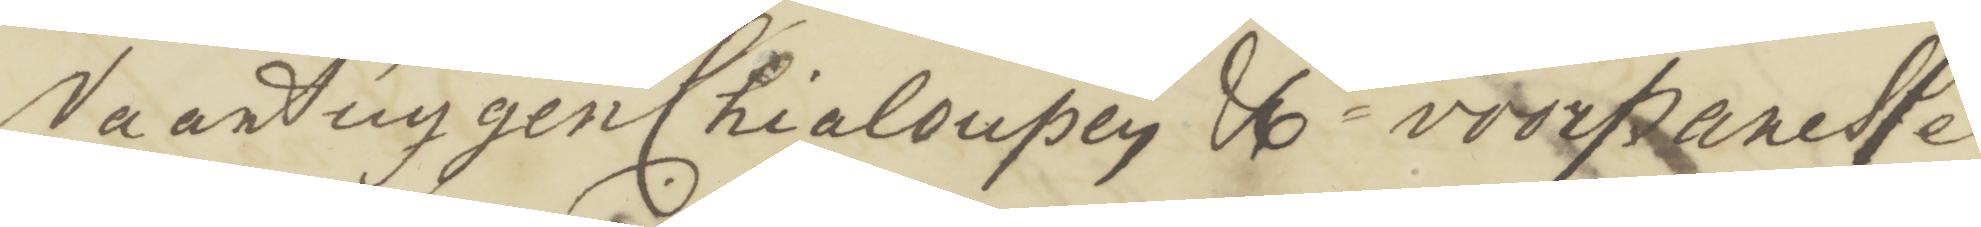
Vaartuijgen Chialoupen &=a voor paresse
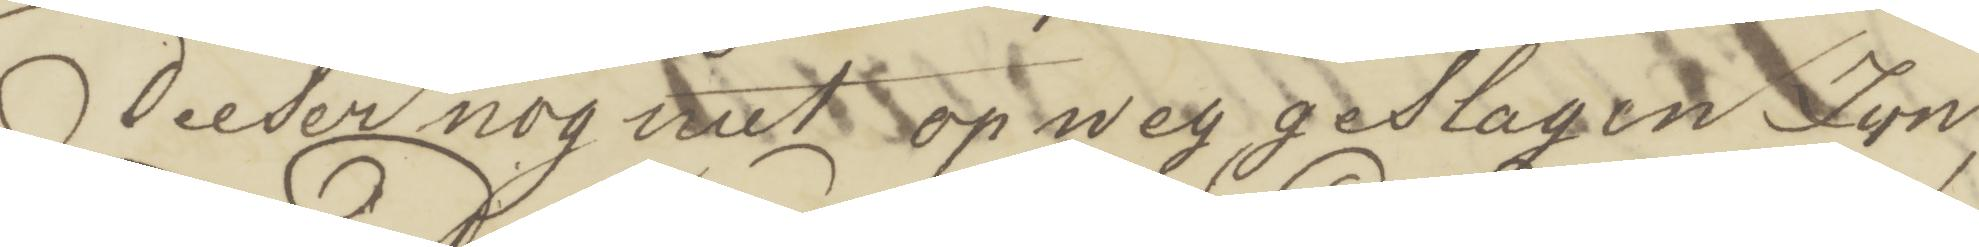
deeser nog niet op weg geslagen Zijn,
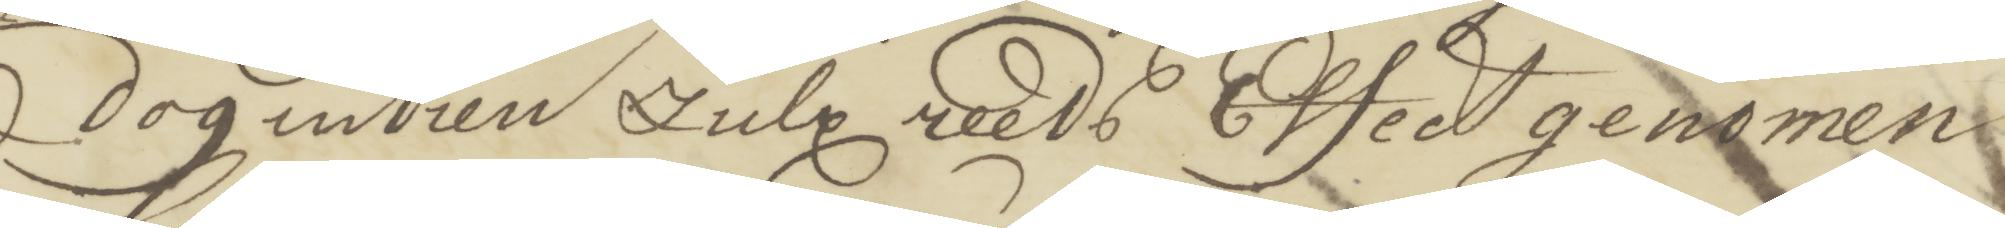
dog indien zulx reeds Effect genomen
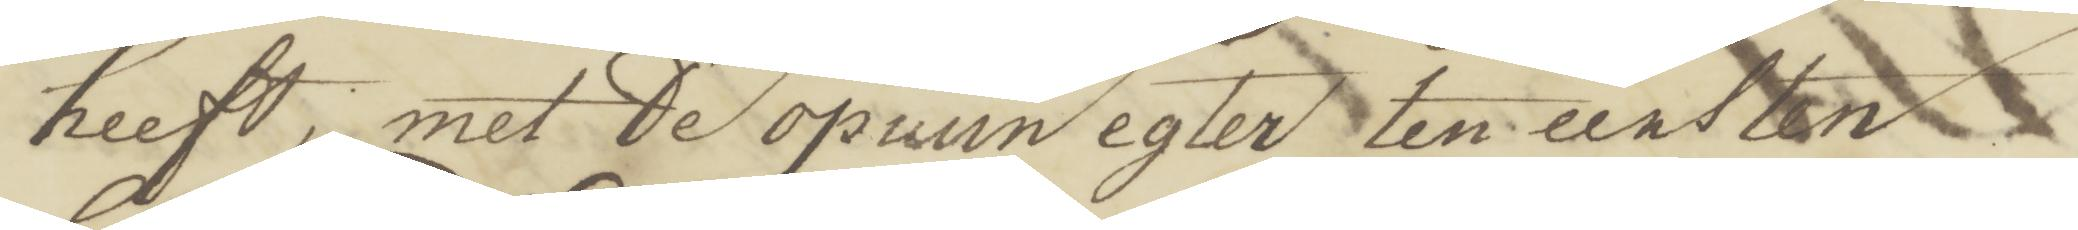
heeft; met de opium egter ten eersten
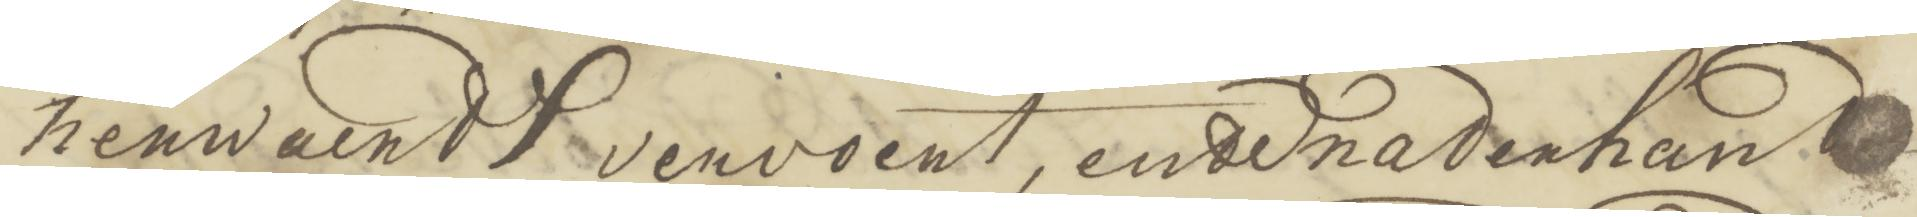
herwaerd 's vervoert, en de naderhand
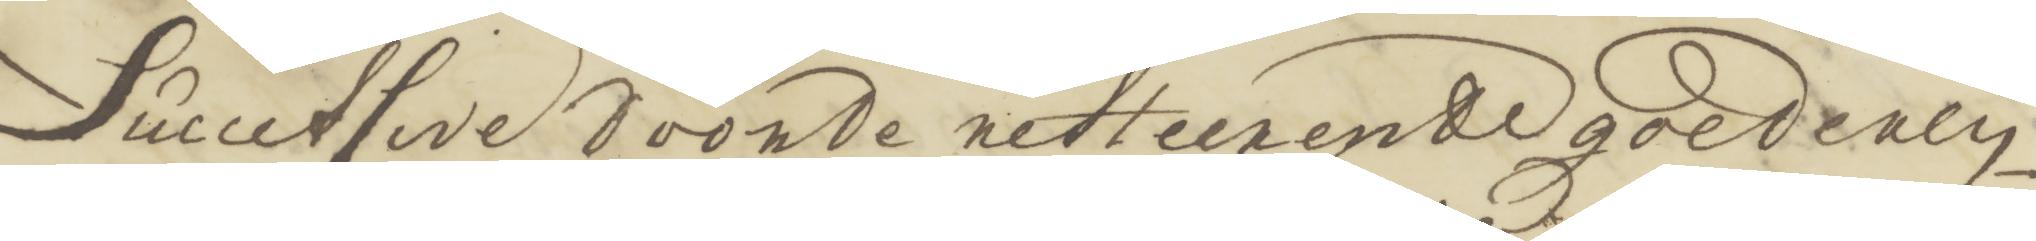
Successive door de resteerende goederen
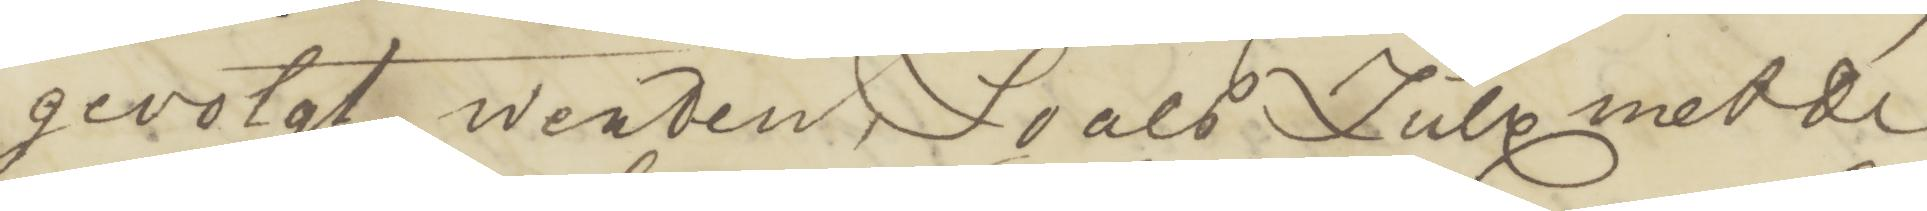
gevolgt werden, So als Zulx met de
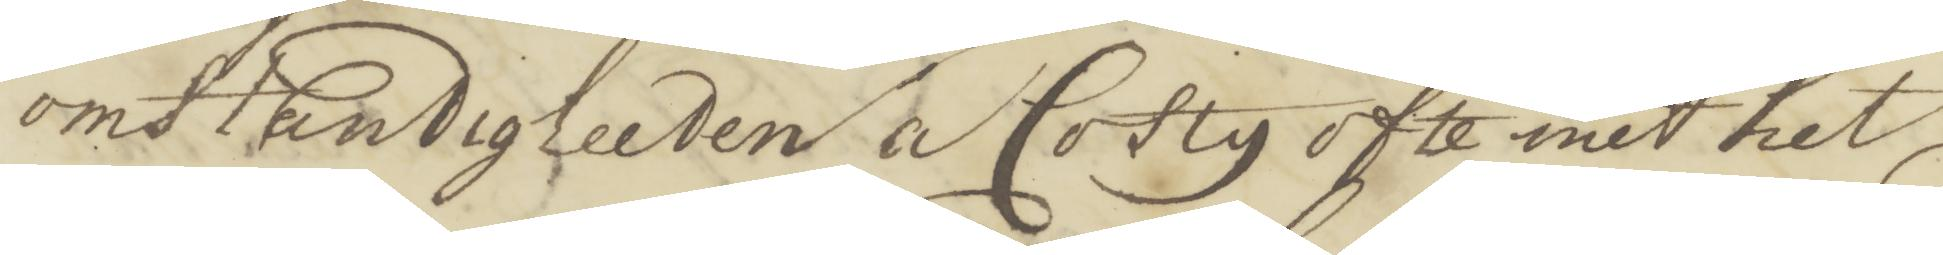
omstandigheeden á Costy ofte met het
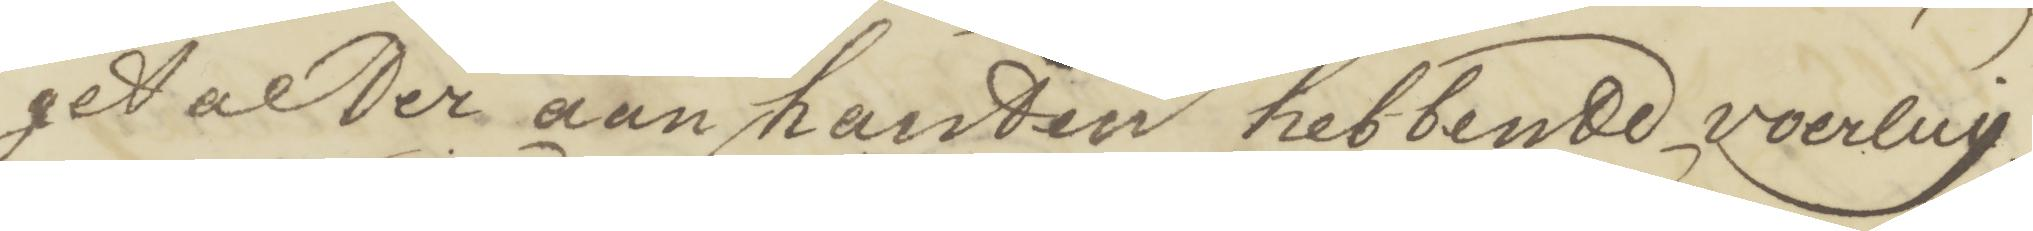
getal der aan handen hebbende voerluij
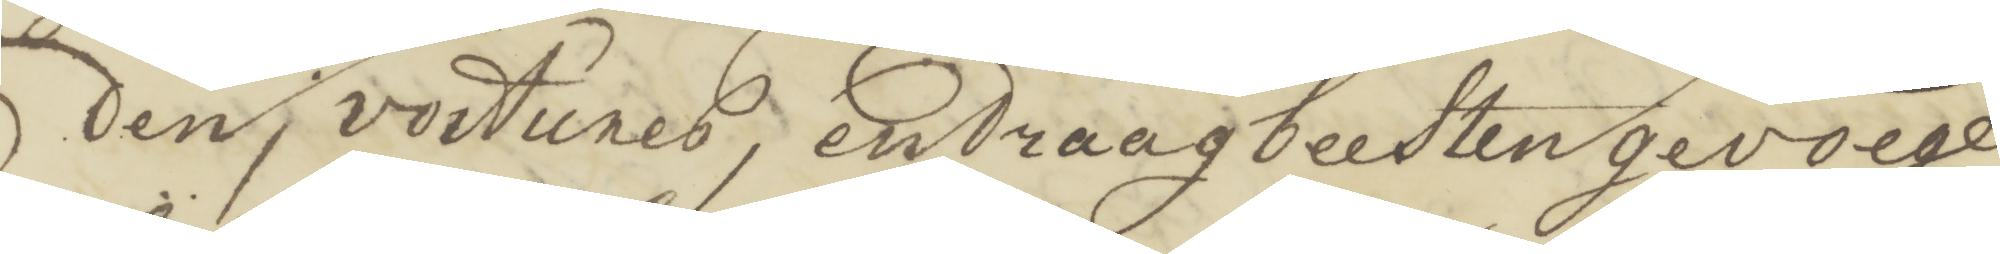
den voitures, en draagbeesten gevoege
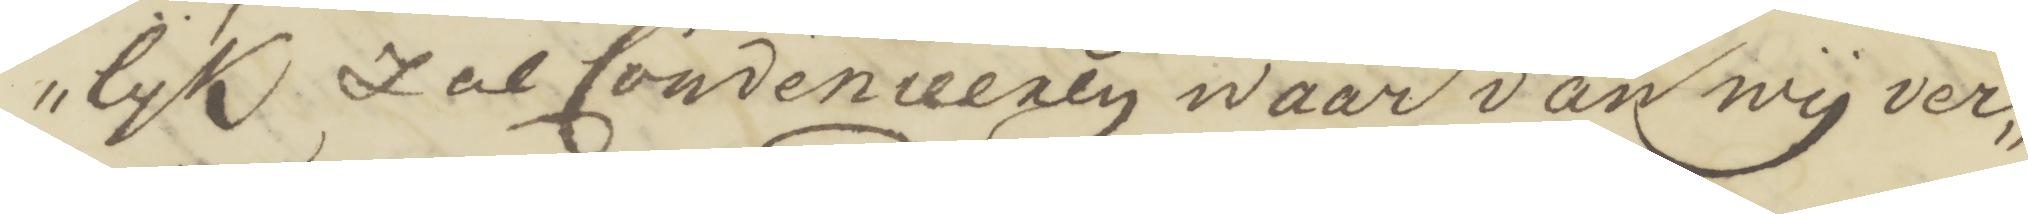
„lijk zal condevenieeren waar van wij ver„
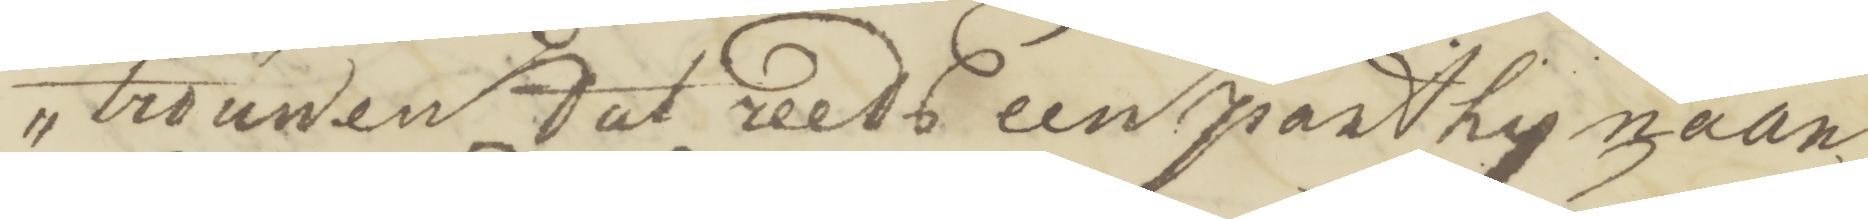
„trouwen dat reeds een parthij naar
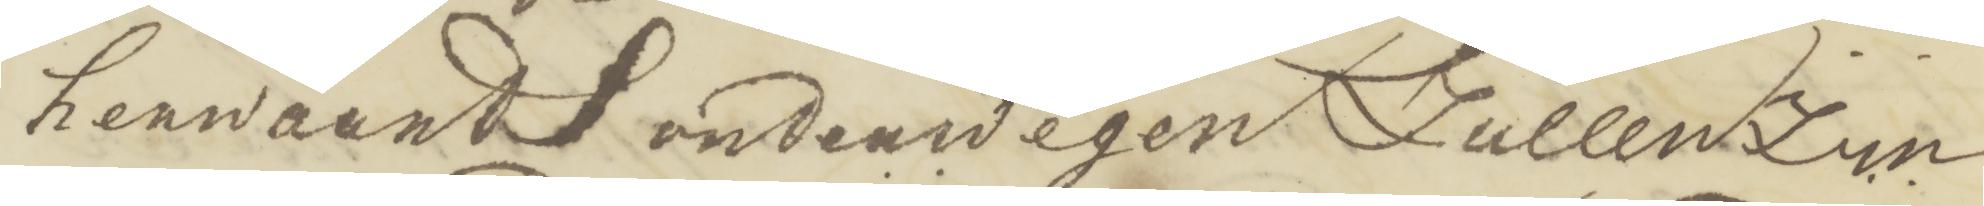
herwaards onderwegen Zullen Zijn
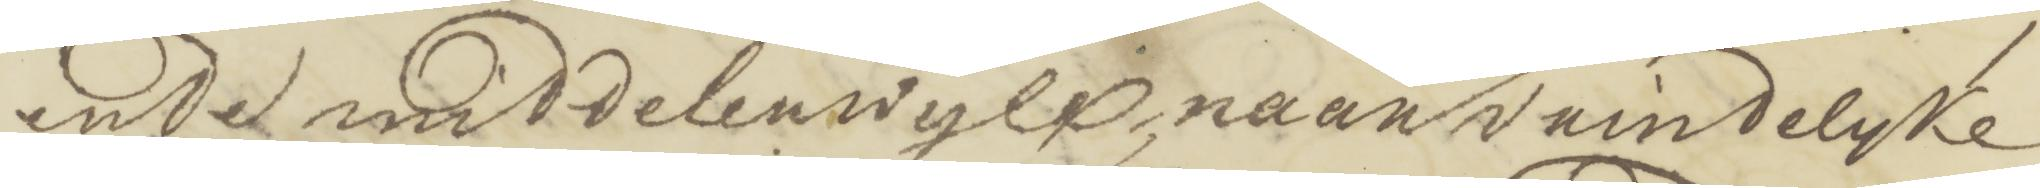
en de middelerwijle naar vrindelijke
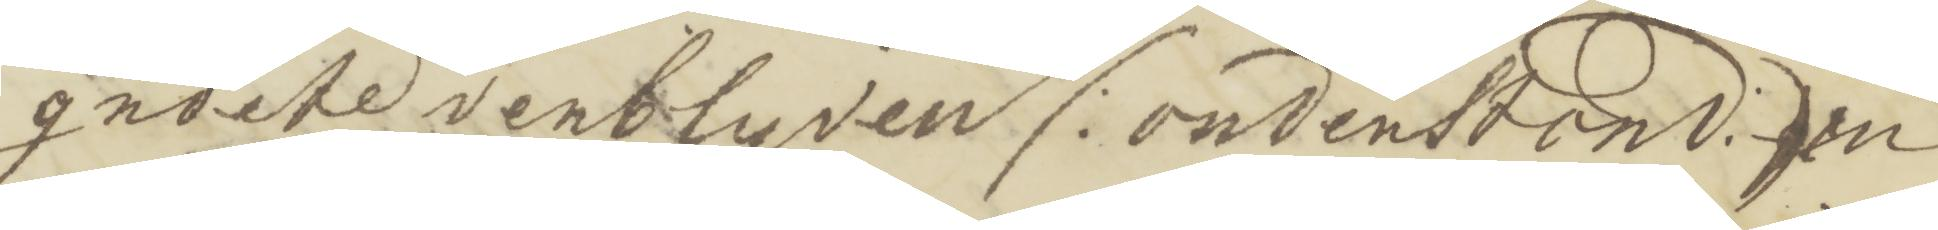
groete verblyven /:onderstond:) en
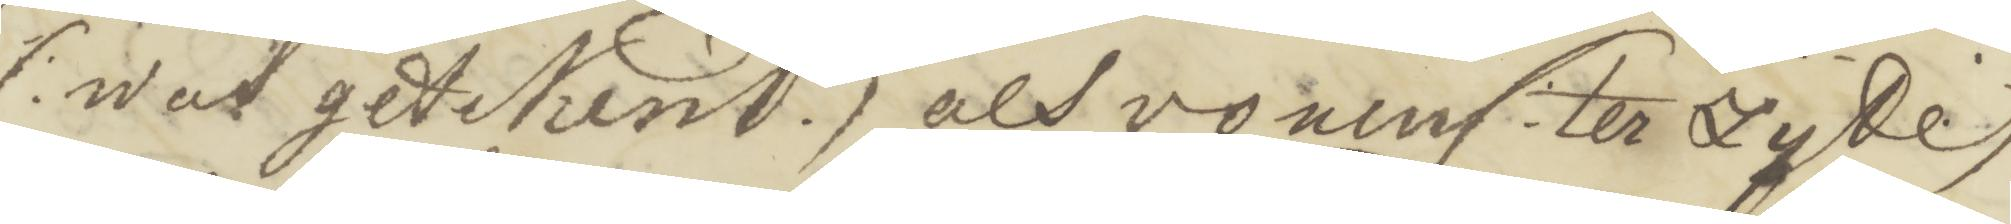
(: was getekend :) als voren (: ter zijde:),
